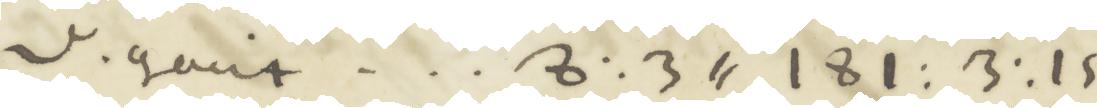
d:o gout . . . 8:3//181:3.15.
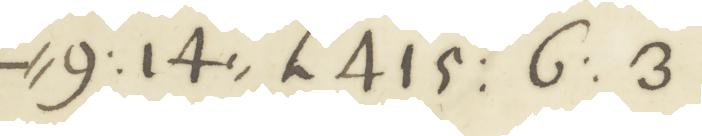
_//9:14: ƒ415.6:3
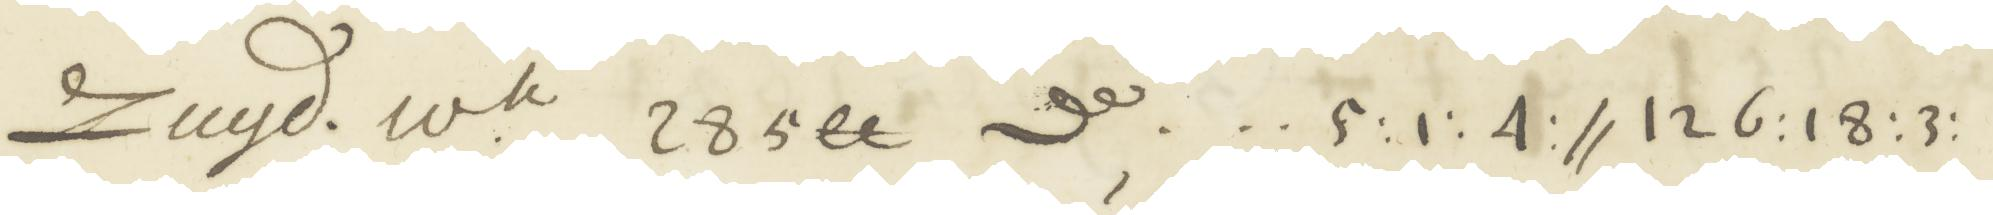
Zuyd. w.k 285 lb _ . . . 5:1:4.//.126:18:3:
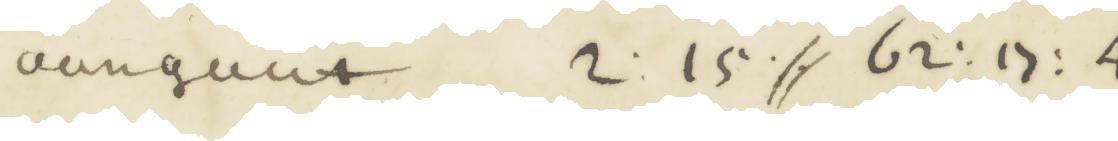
aangout 2:15.//62:17:4
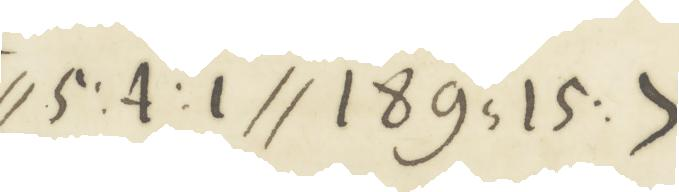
_//5:4:1 // 189:15:7
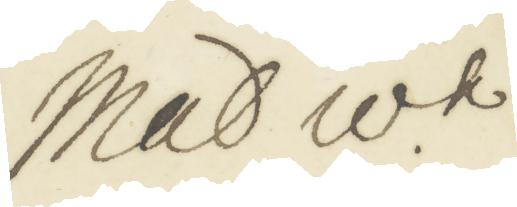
Mal w.k 265 lb o . . . 4:11:9 // 115.19:6
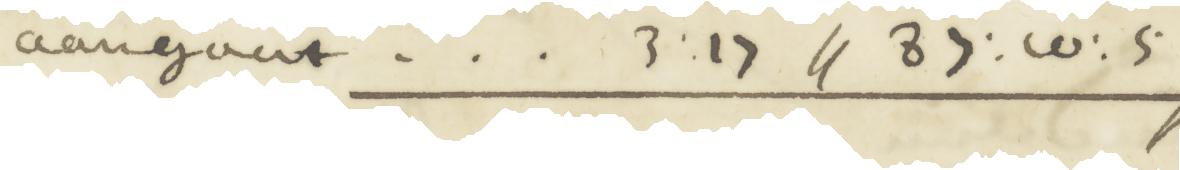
aangout . . . 3:17 // 85:10:8.
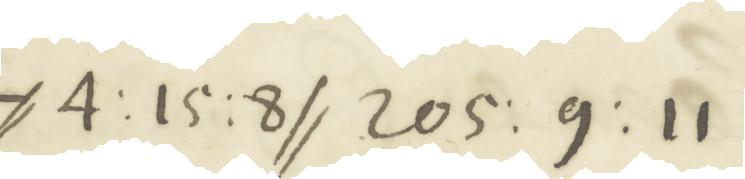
_//4:15:8// 205:9:11
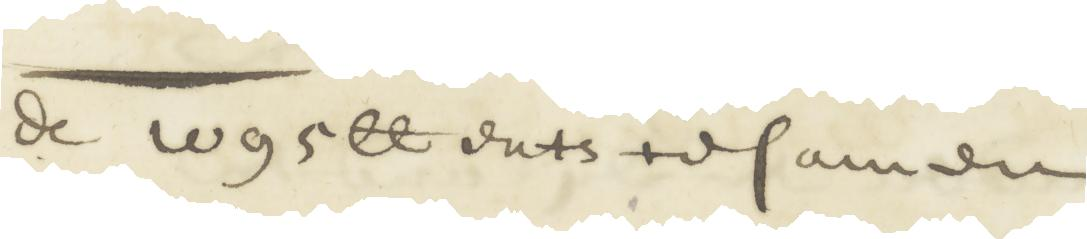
de w 95 lb erts te samen 20:1:96810:11:5
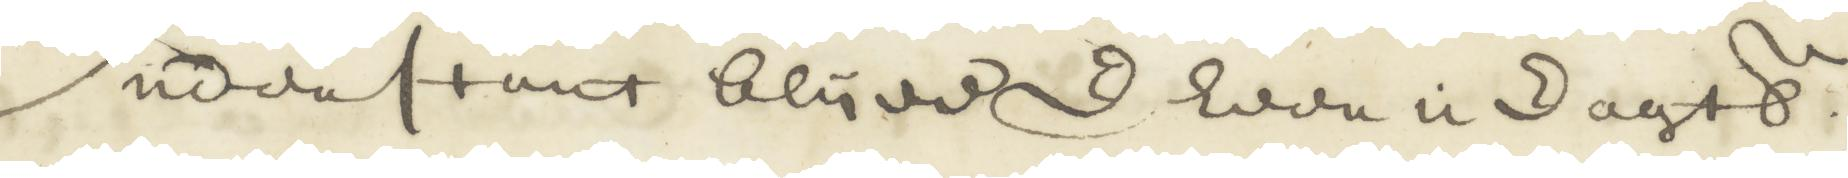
Onderstant blijve E heer u E agtb:'
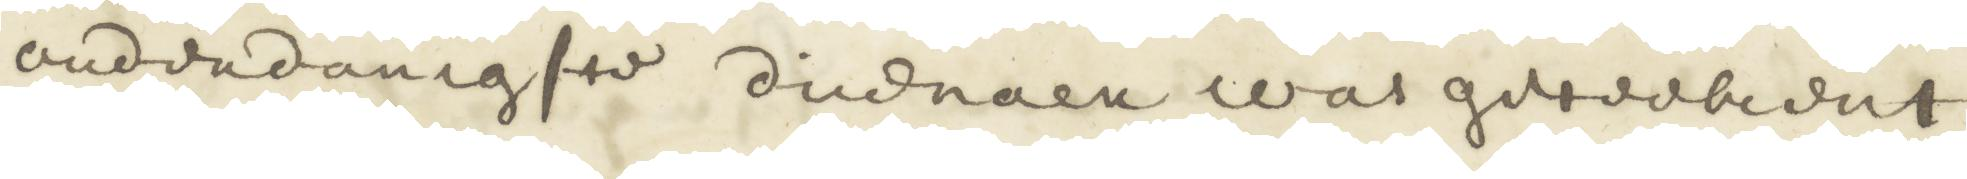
onderdanigste dienaer was geteekent
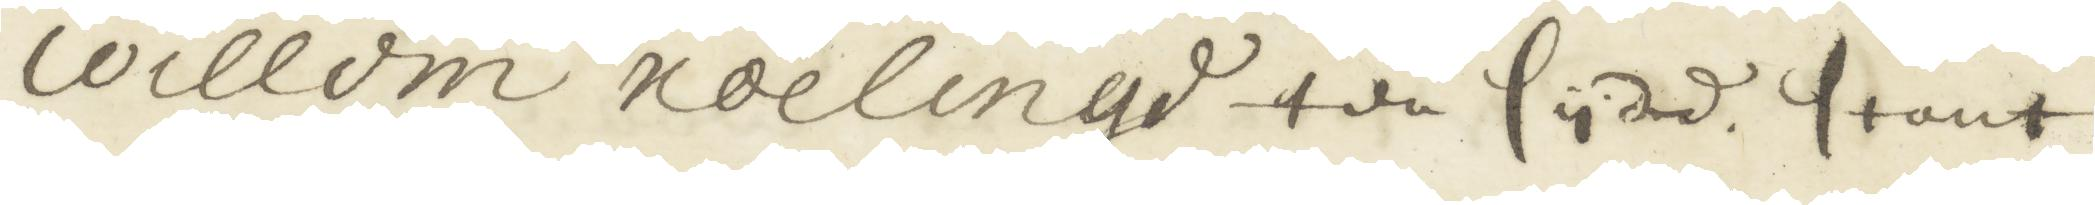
willem roelinge ter sijde. stont
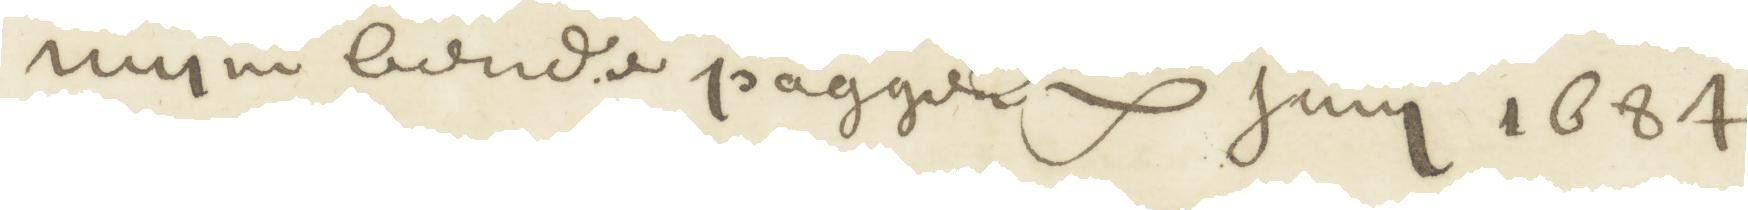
my in bene.e pagger xn junij 1684
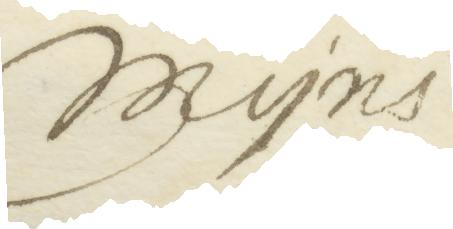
Mijns
